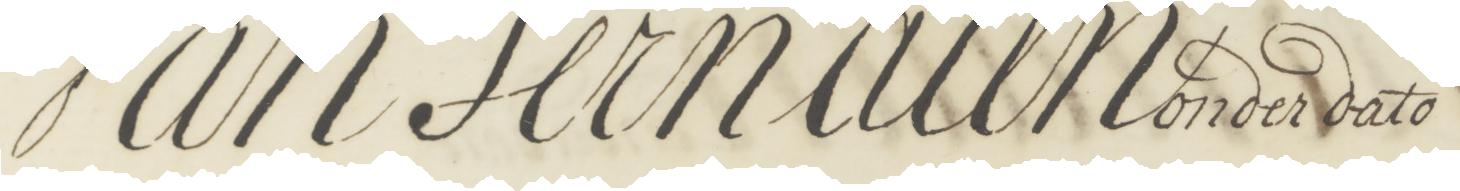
Van Ternaten onder dato
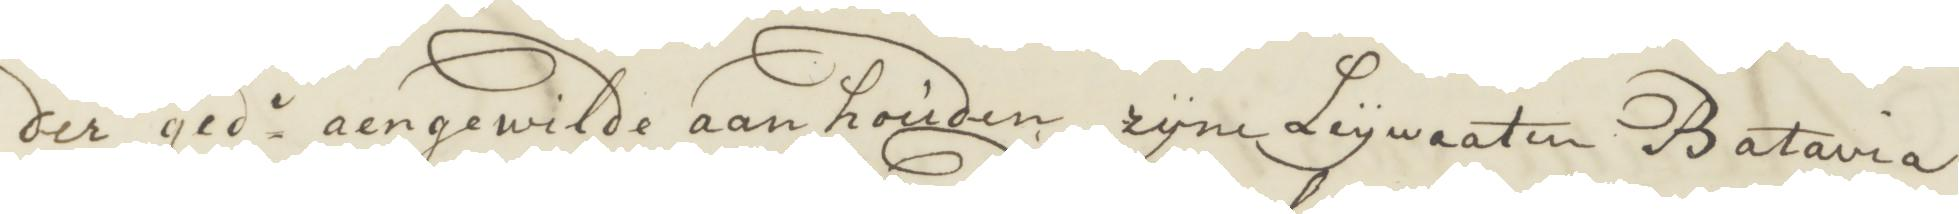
der ged=e aengewilde aan houden zijne Leijwaaten Batavia
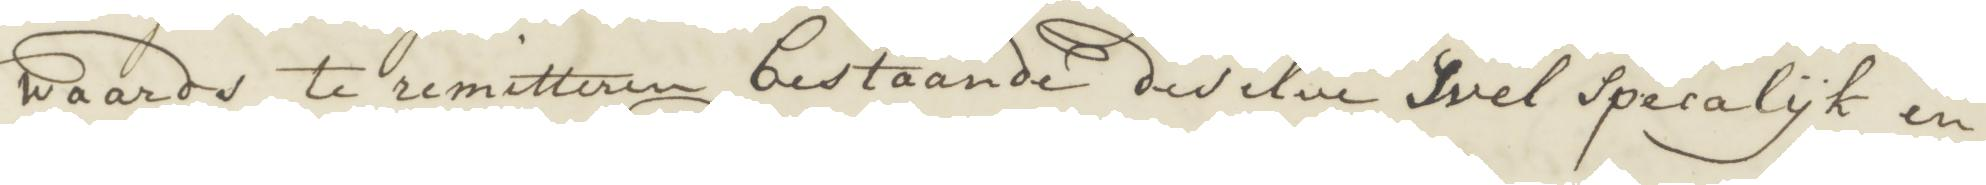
waards te remitteren bestaande deselve wel specalijk en
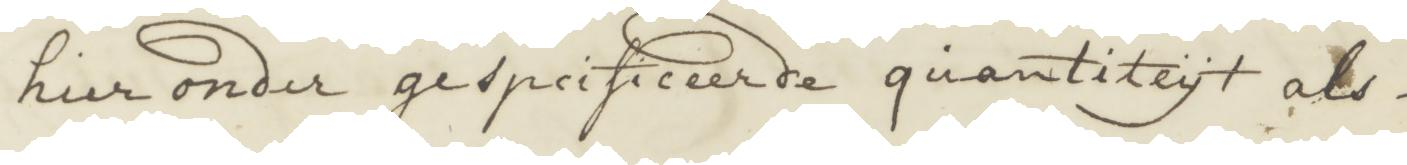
hier onder gespeificeerde quantiteijt als
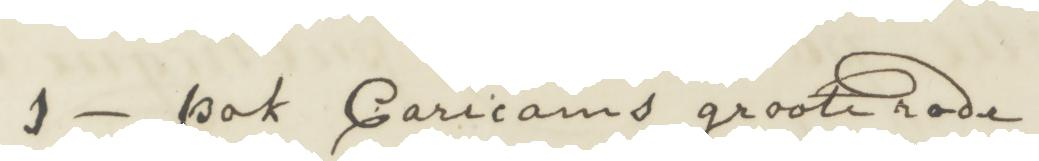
1 — pak Caricams groote rode
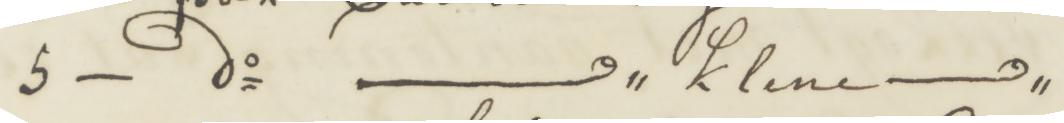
5 — d=o _o „ klene _o „
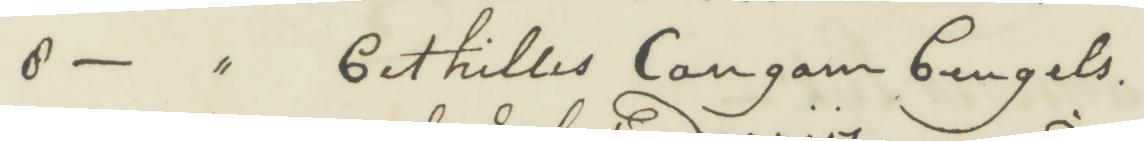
8 — „ bethilles Cangam bengels.
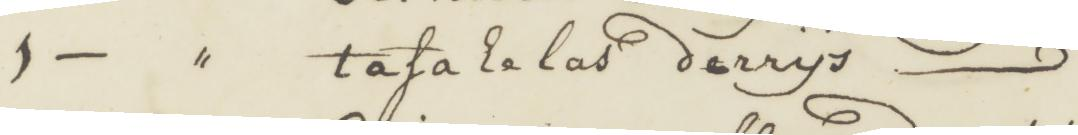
1 — „ tasahalas derrijs _o
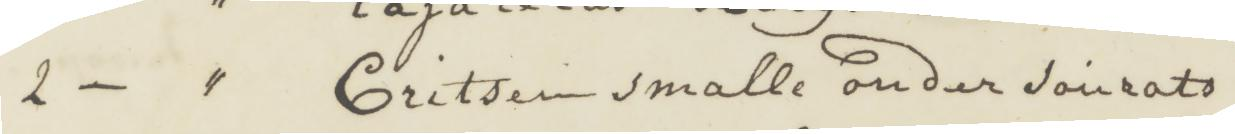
2 — „ Critsen smalle onder sourats
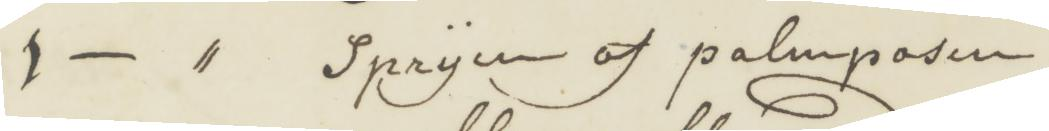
1 — „ sprijm of palmposen
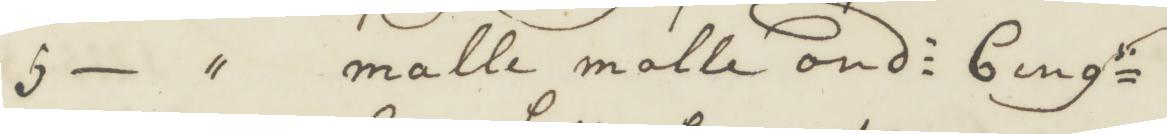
5 — „ malle molle ond=r beng=s
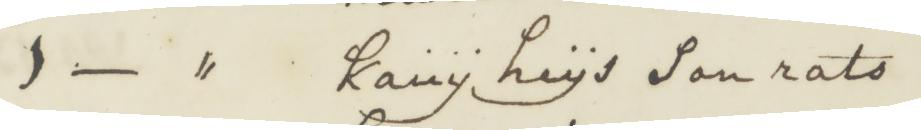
1 — „ Kauij heijs son rats
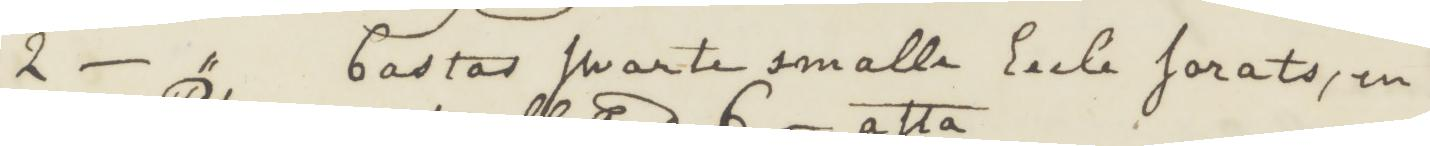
2 — „ bastas swarte smalle heele sorats, en
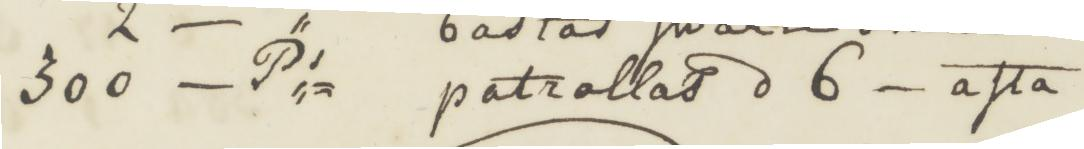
300 — P„=s patrollas d 6 — asta
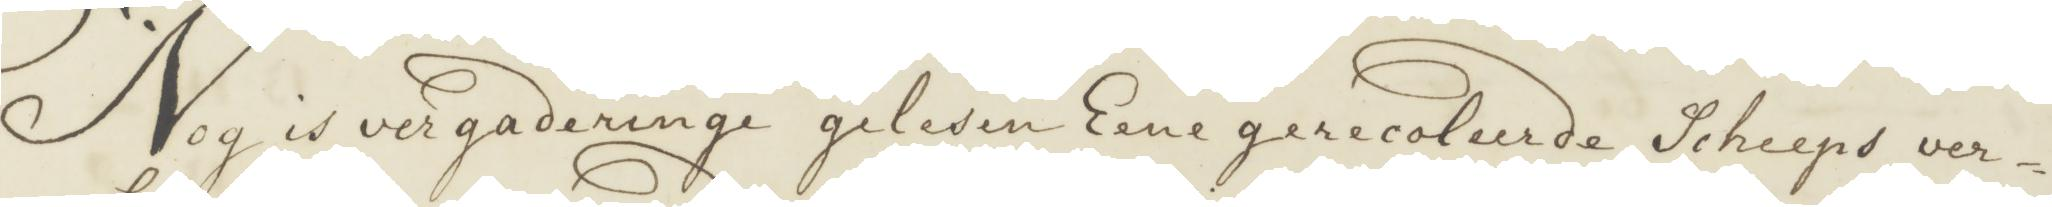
Nog is vergaderinge gelesen Eene gerecoleerde scheeps ver=
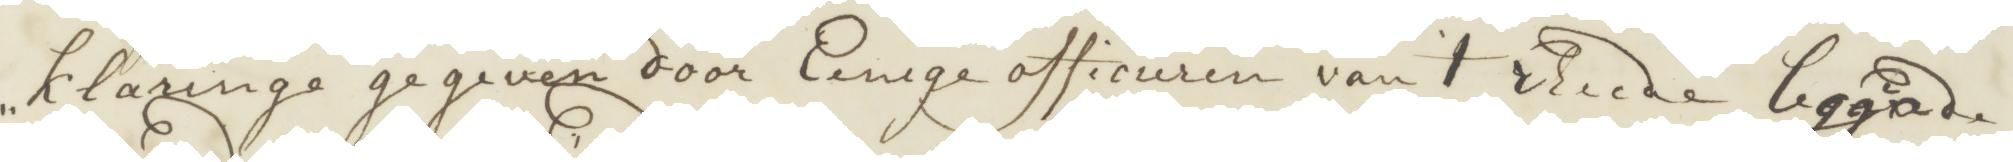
„klaringe gegeven door Eenige officieren van ’t rheede leggende
